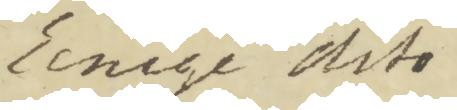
Eenige dito
